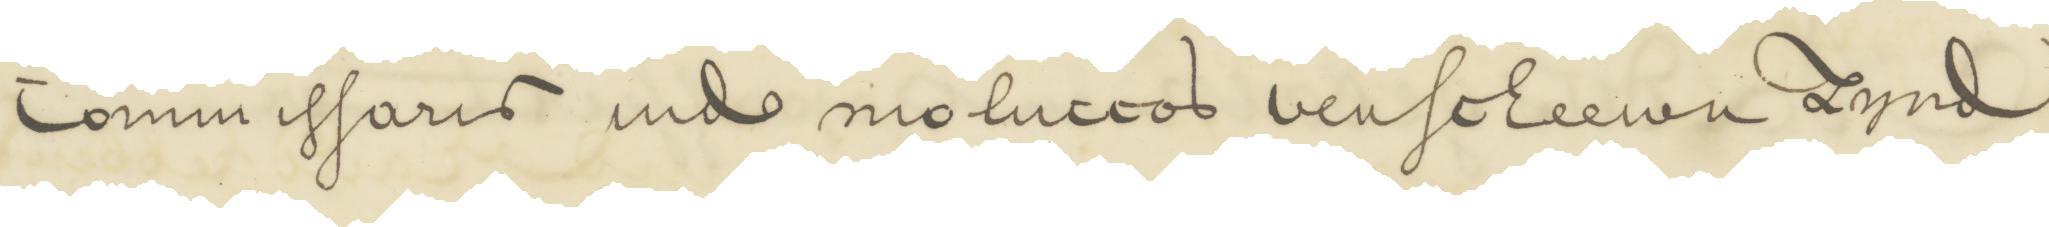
Commissaris inde moluccos verscheenen zynde
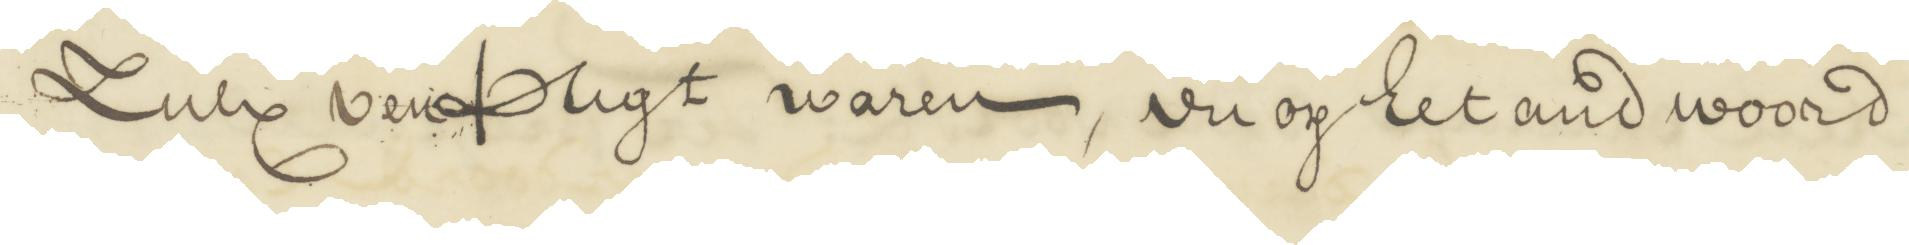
zulx verpligt waren, en op het andwoord
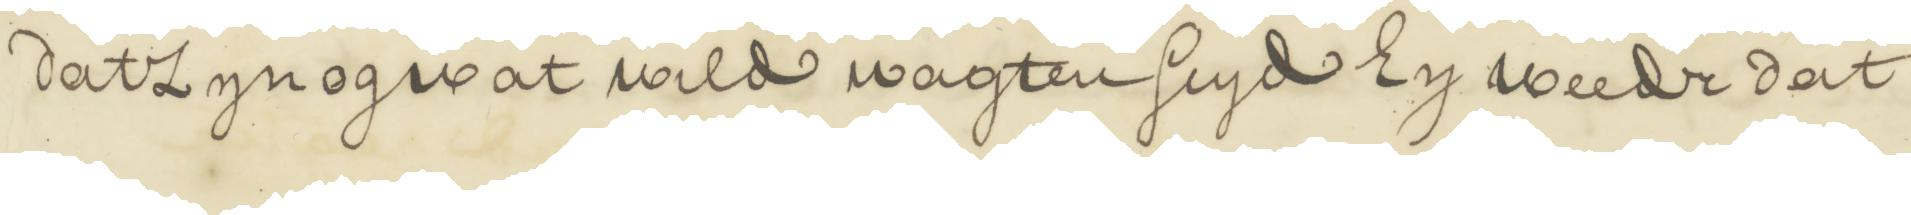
dat zy nog wat wilde wagten seyde hy weeder dat
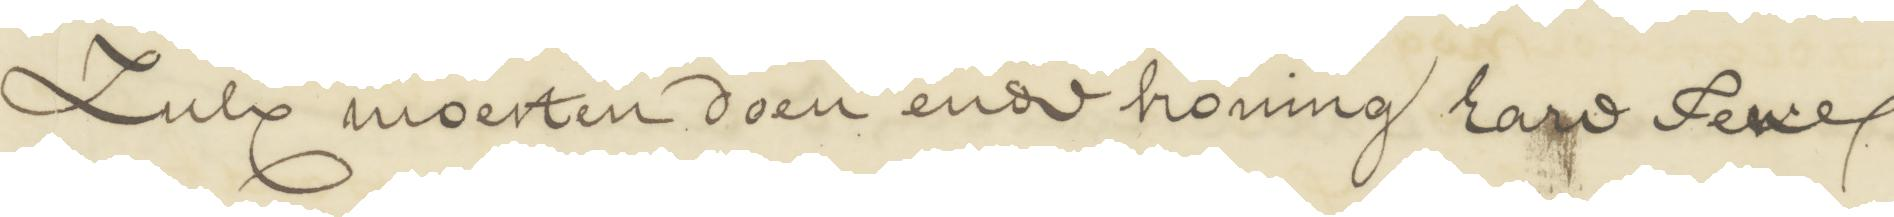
zulx moesten doen ende koning hare Eere
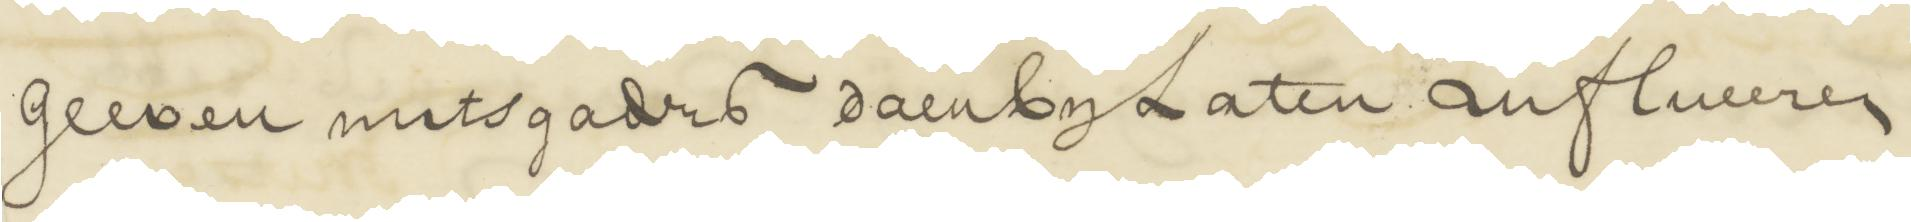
geeven mitsgaders daerby Laten influeeren
